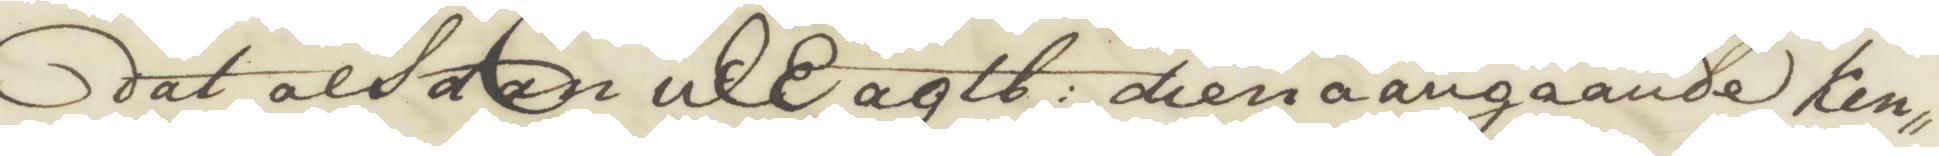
dat als aan uEE agtb: dien aangaande ken„
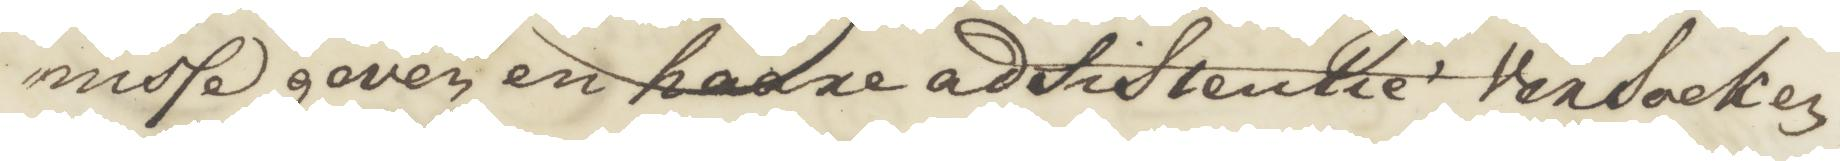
„nisse geven en haare adsistentie versoeken
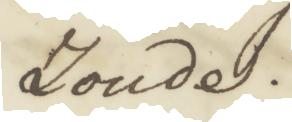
zoude.
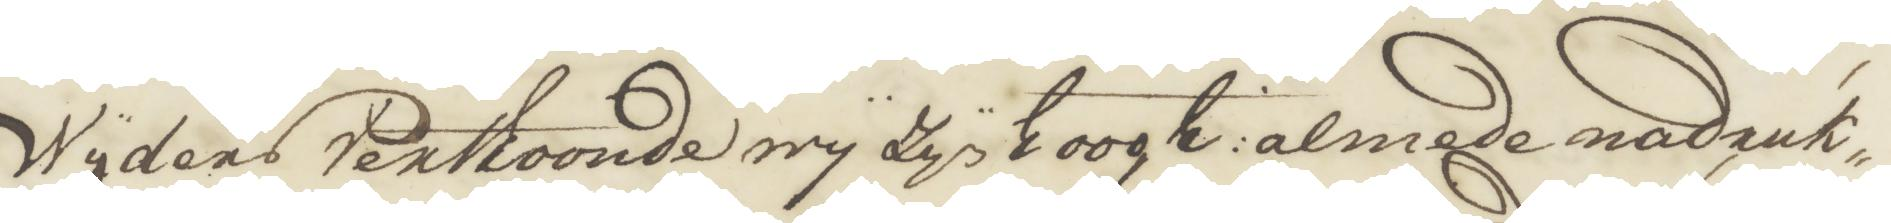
Wijders verthoonde wij zijn hoogh:t almede nadruk„
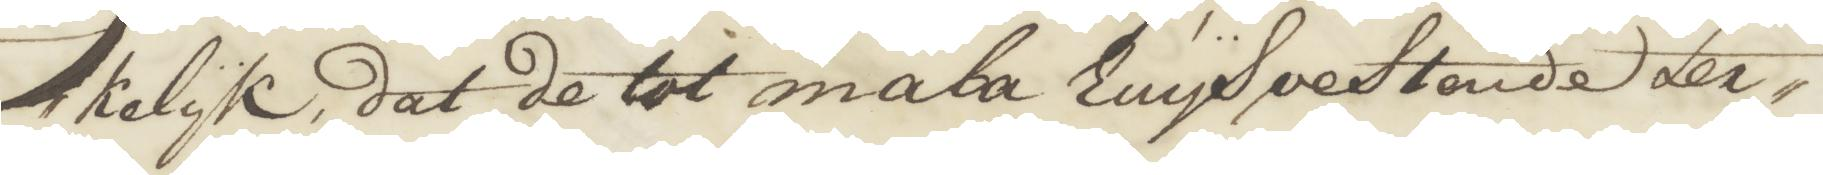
„kelijk, dat de tot mala huijsvestende ter„
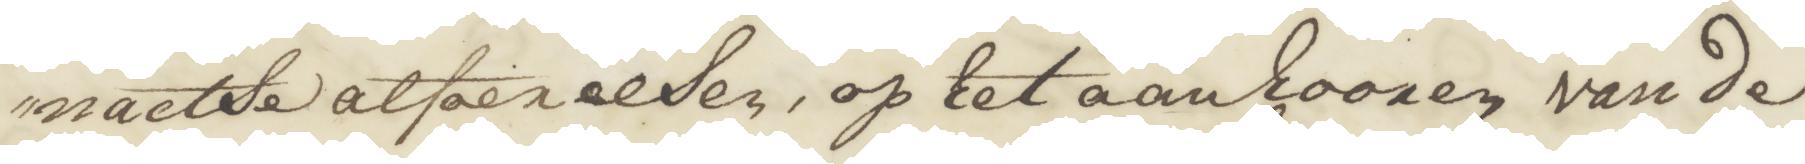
„naetse alfoereesen, op het aanhooren van de
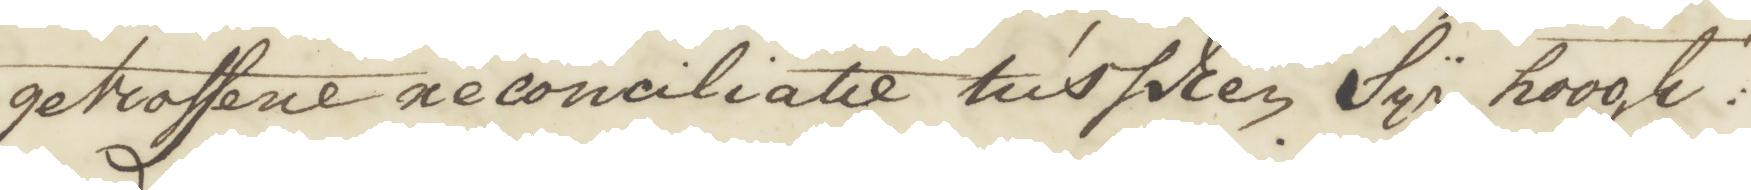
getroffene reconciliatie tusschen sijn hoogh:t
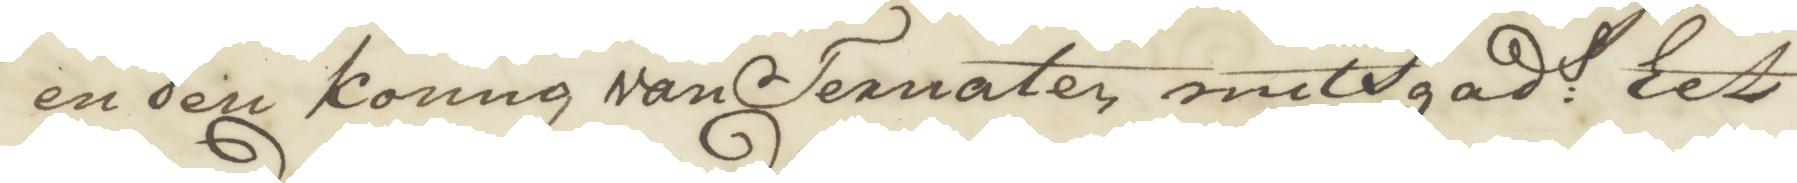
en den koning van Ternaten mitsgad:s het
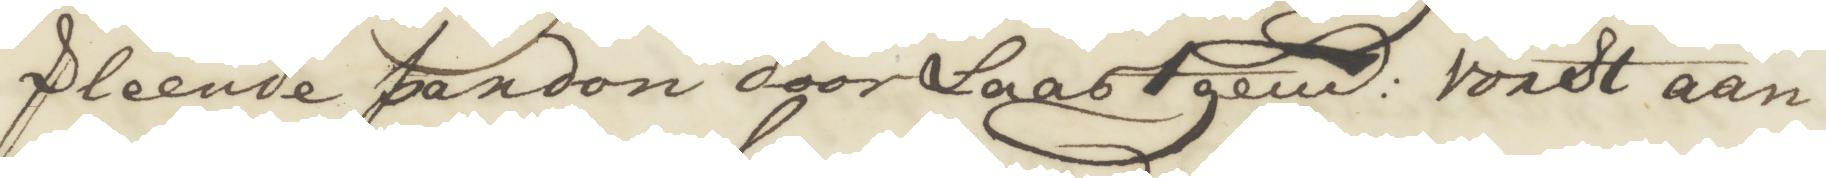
verleende pardon door laastgem: vorst aan
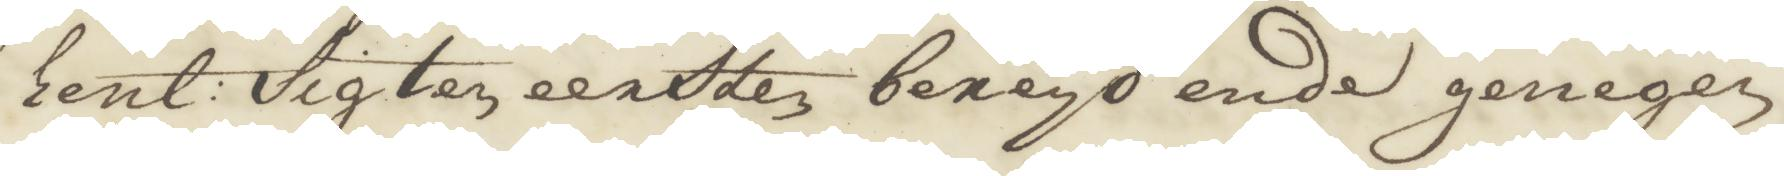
henl: sig ten eersten bereyd ende genegen
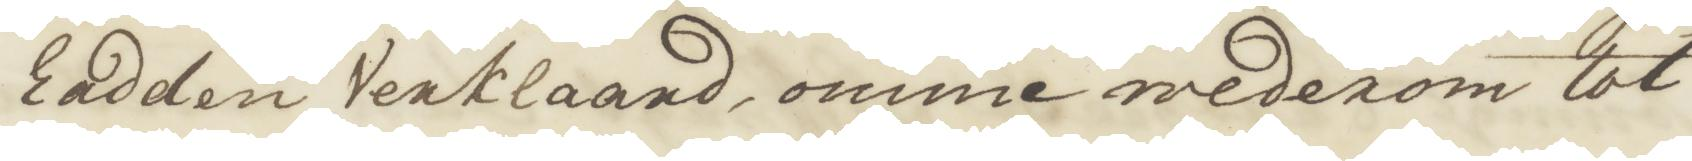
hadden verklaard, omme wederom tot
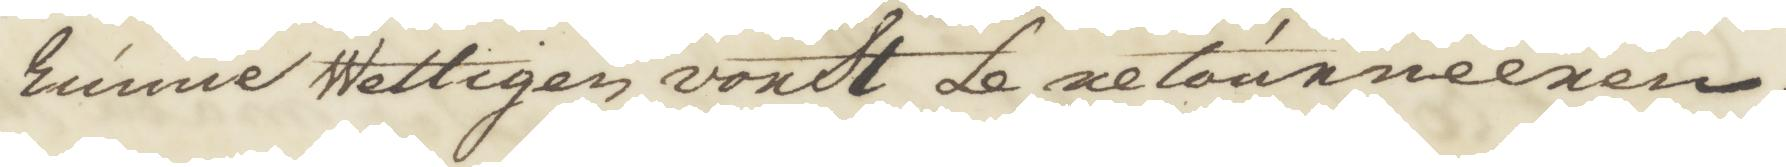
hunne wettigen vorst te retourneeren
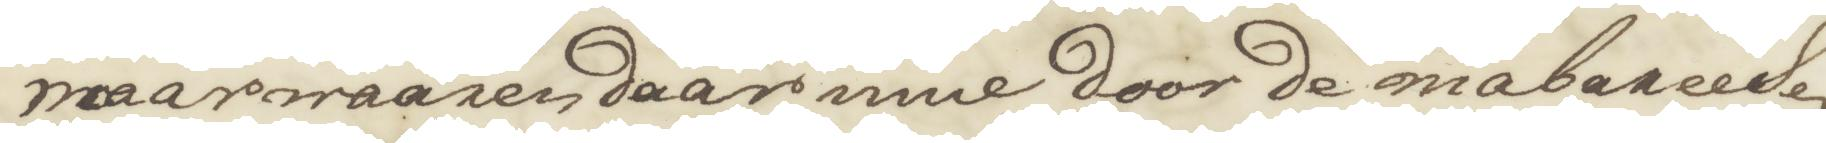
maar waaren daar inne door de mabareesen
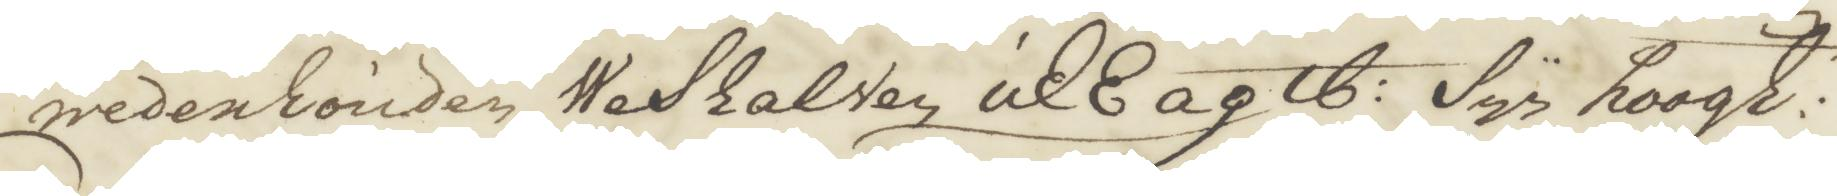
wederhouden weshalven uEE agtb: sijn hoogh:t
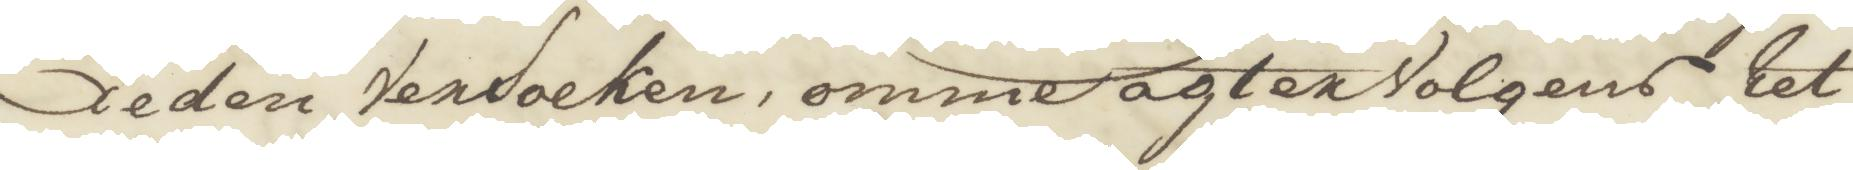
deden versoeken, omme agtervolgens het
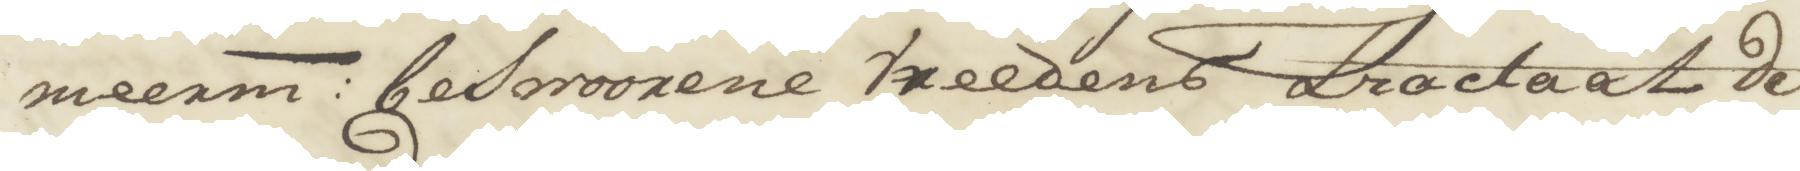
meerm: beswoorene vreedens tractaat de
